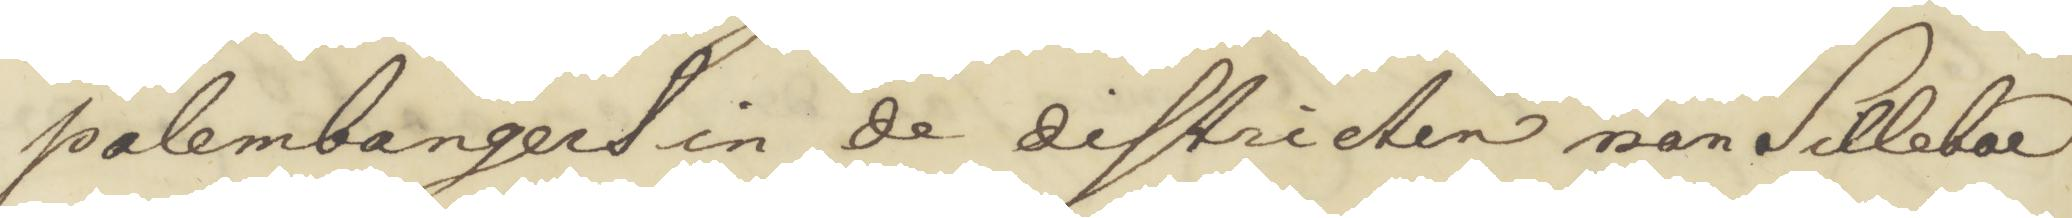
palembangers in de districten van Silleboe
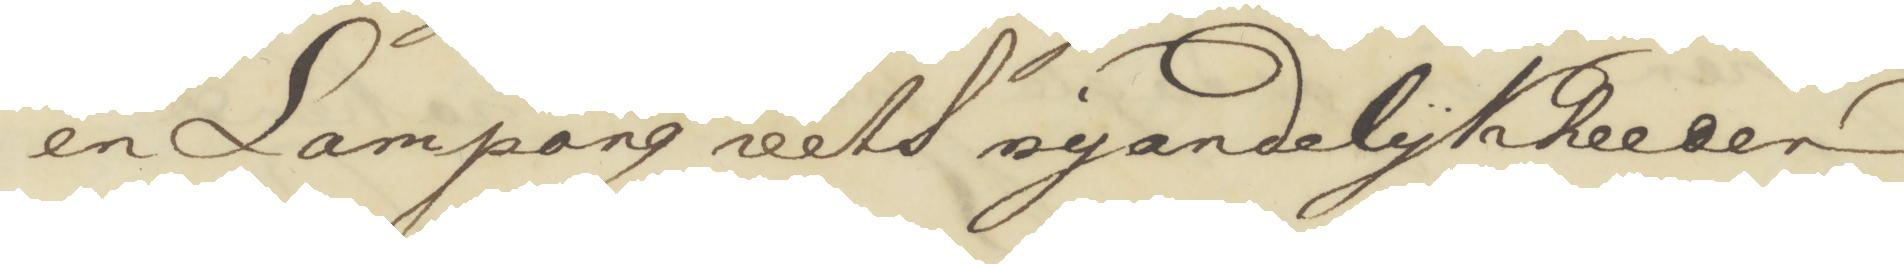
en Lampong reets vijandelijkheeden
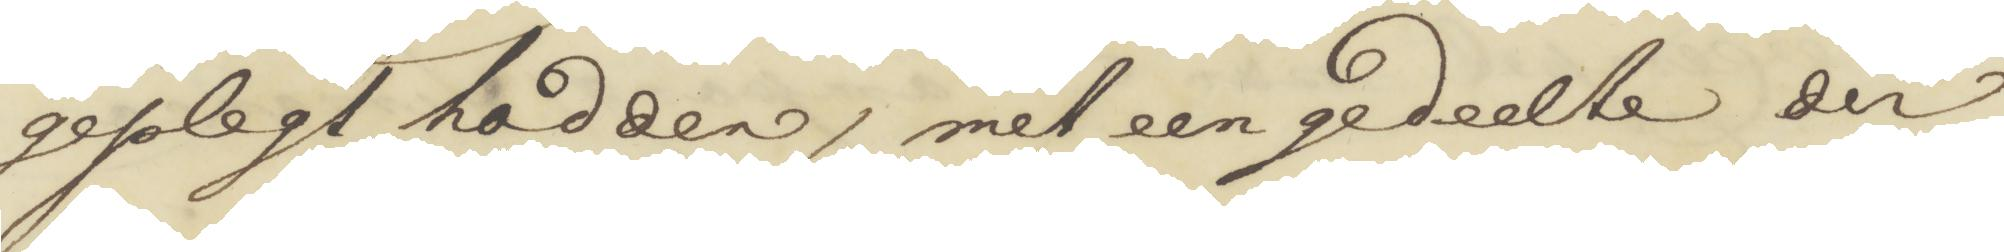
geplegt hadden, met een gedeelte der
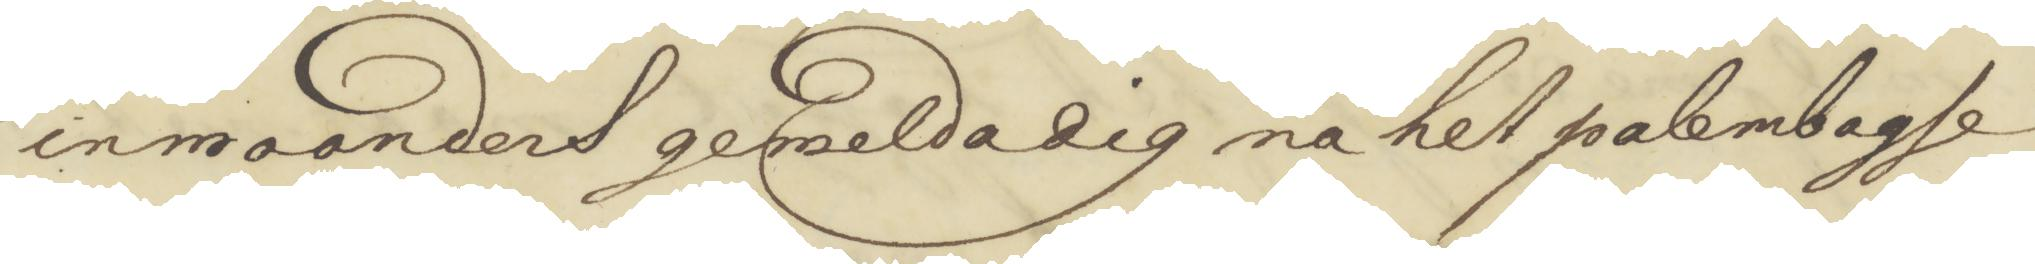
inwoonders geweldadig na het palembagse
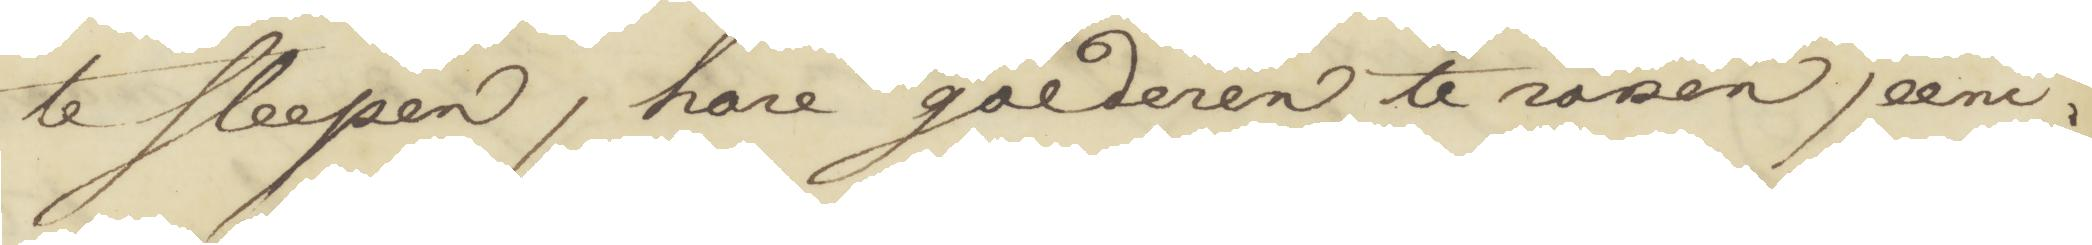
te sleepen, hare goederen te roven, eeni„
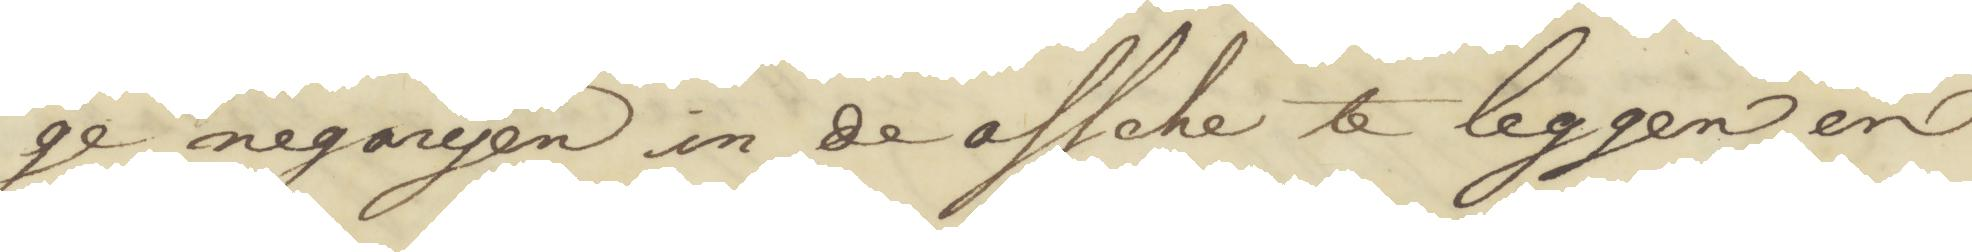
ge negorijen in de assche te leggen en
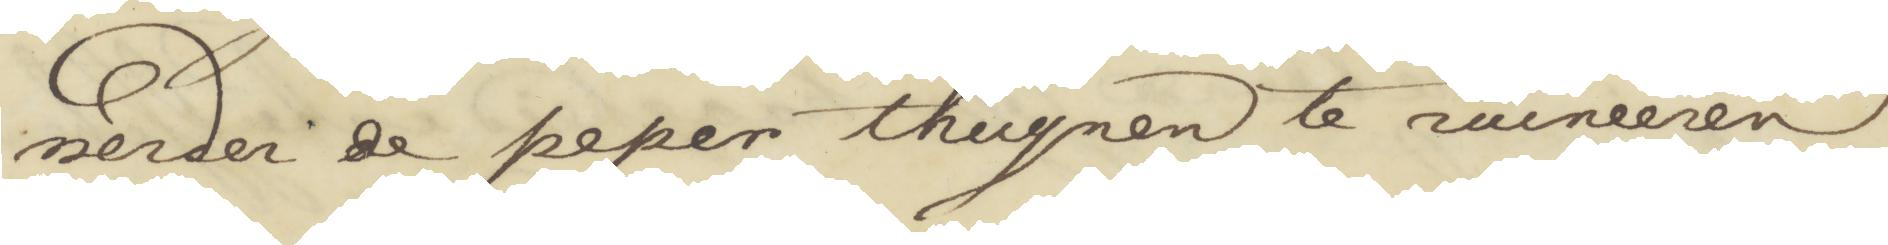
verder de peper thuijnen te ruineeren
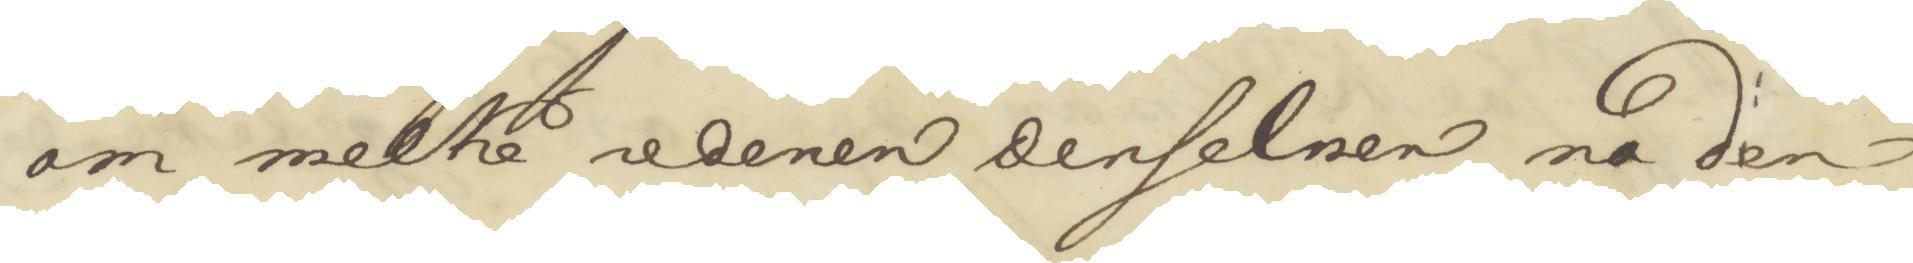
om welke redenen denselven na den
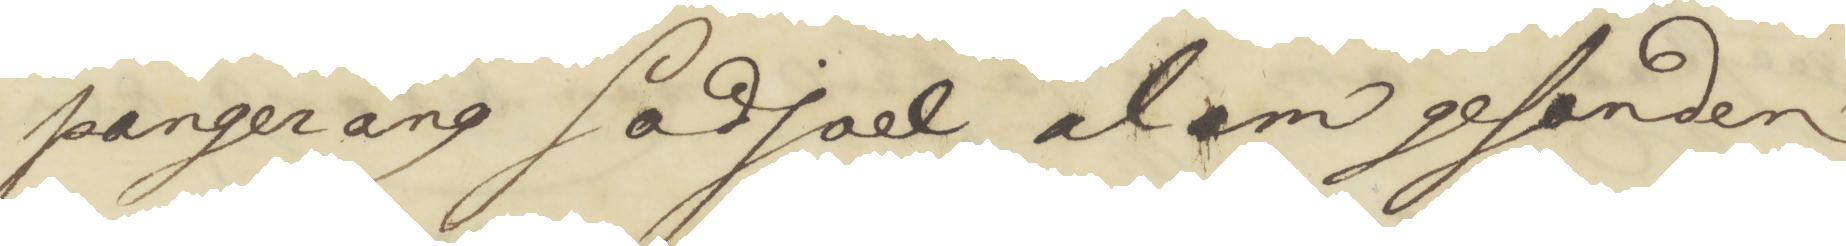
pangerang sadjoel alem gesonden
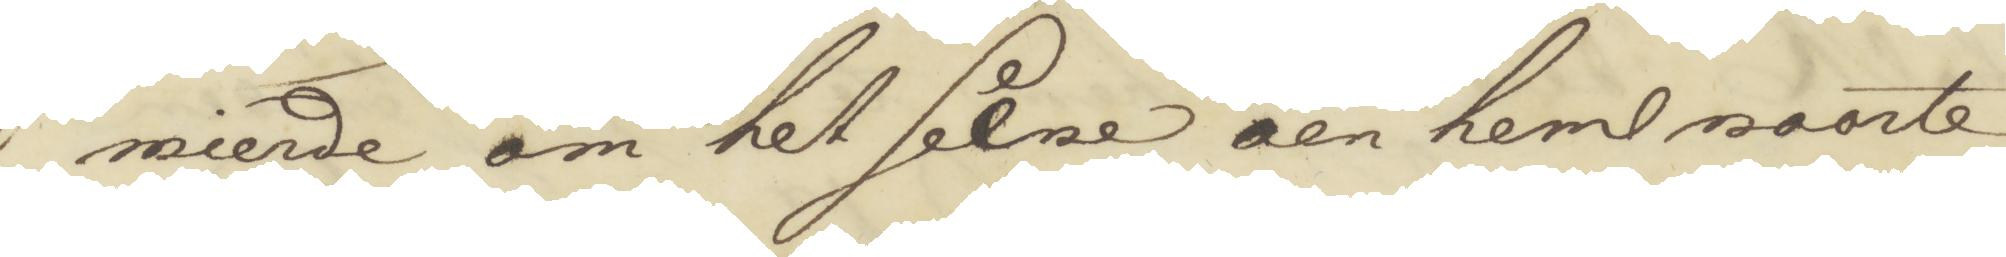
wierde om het selve aen hem voorte
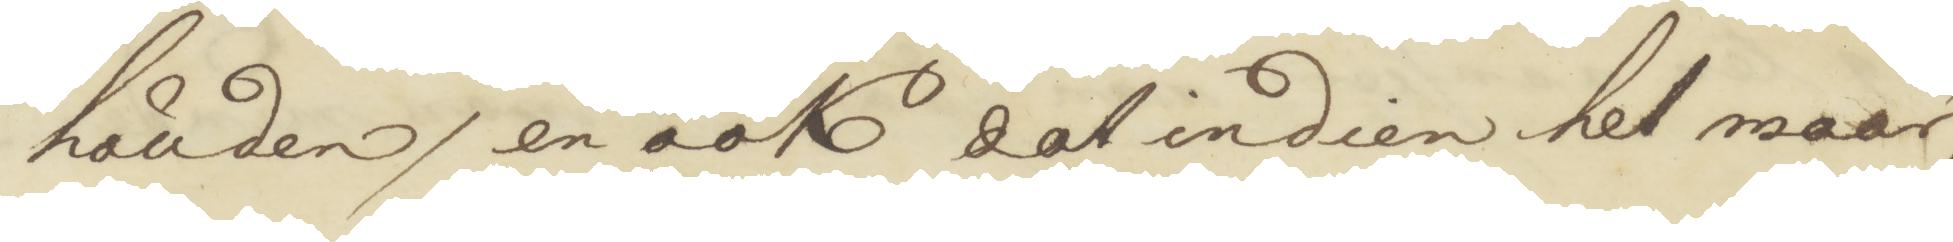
houden, en ook dat indien het waar
